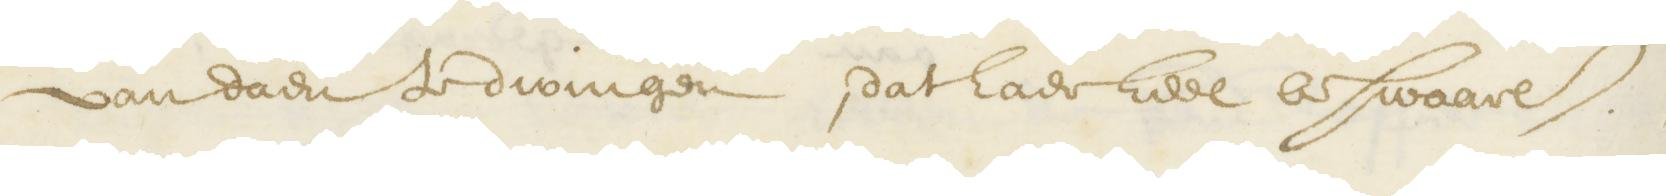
van daen te dwingen, dat haer heel beswaarlijk
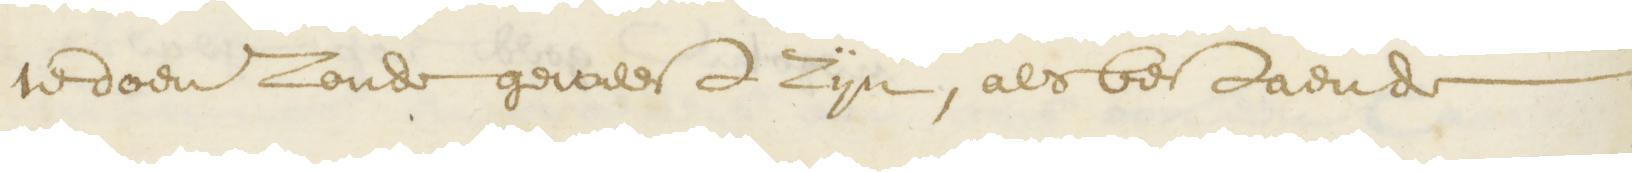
te doen zoude geweest zijn, als bestaende
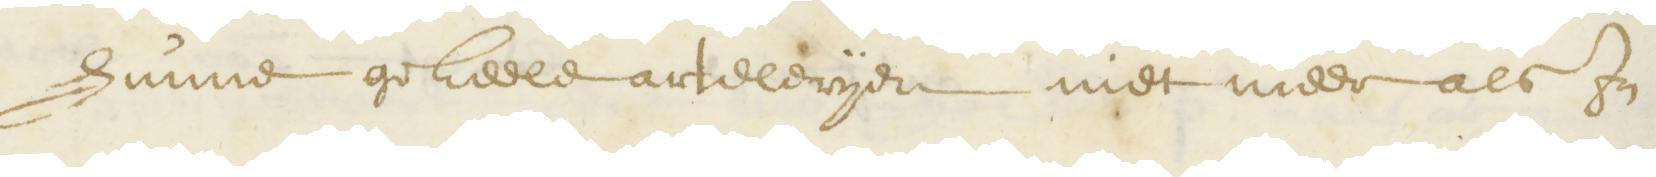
hunne gehele artelerijen niet meer als In
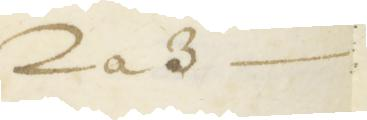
2 a 3
